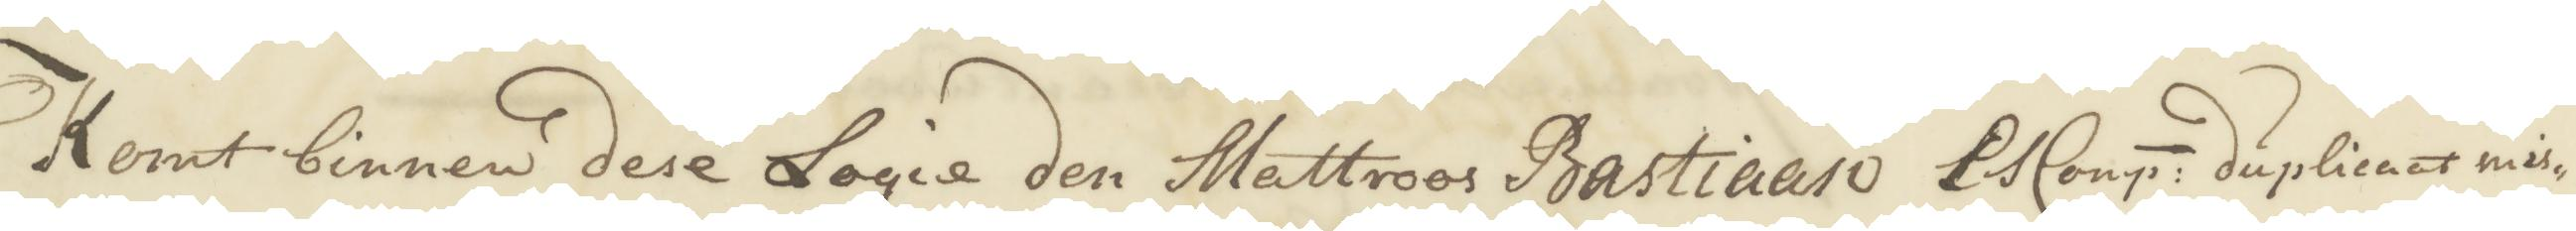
Komt binnen dese Logie den Mattroos Bastiaan EsComp: duplicaat mis„
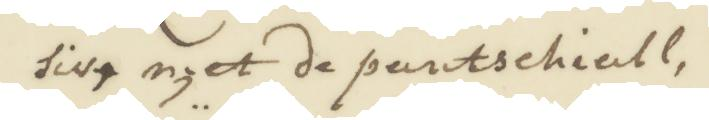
sive met de pantschiall,
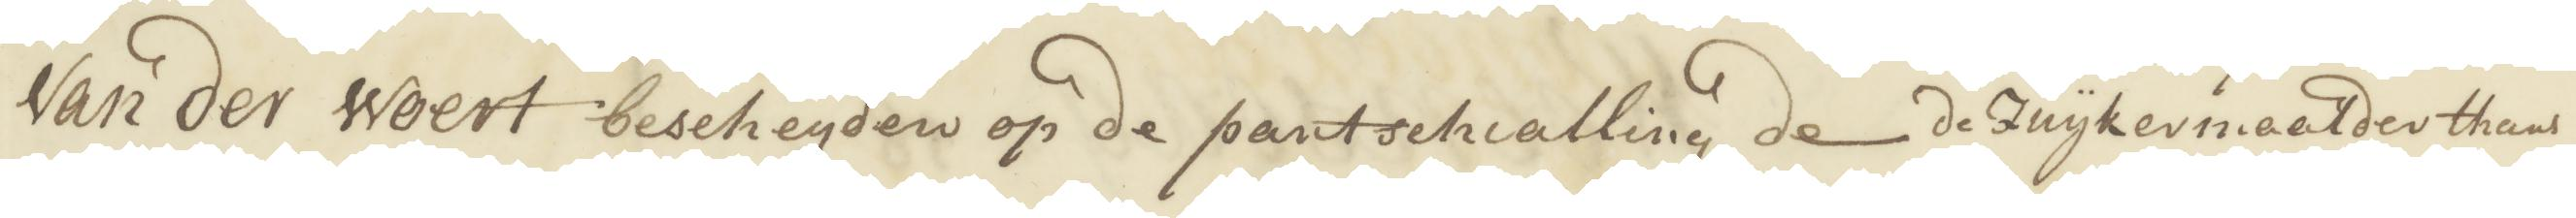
van der woert bescheyden op de pantschialling de de zuijkermaalder thans
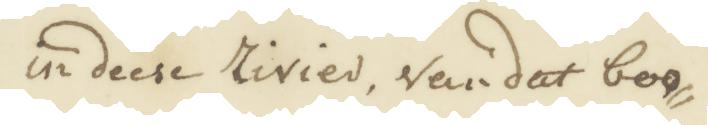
in deese rivier, van dat boo„
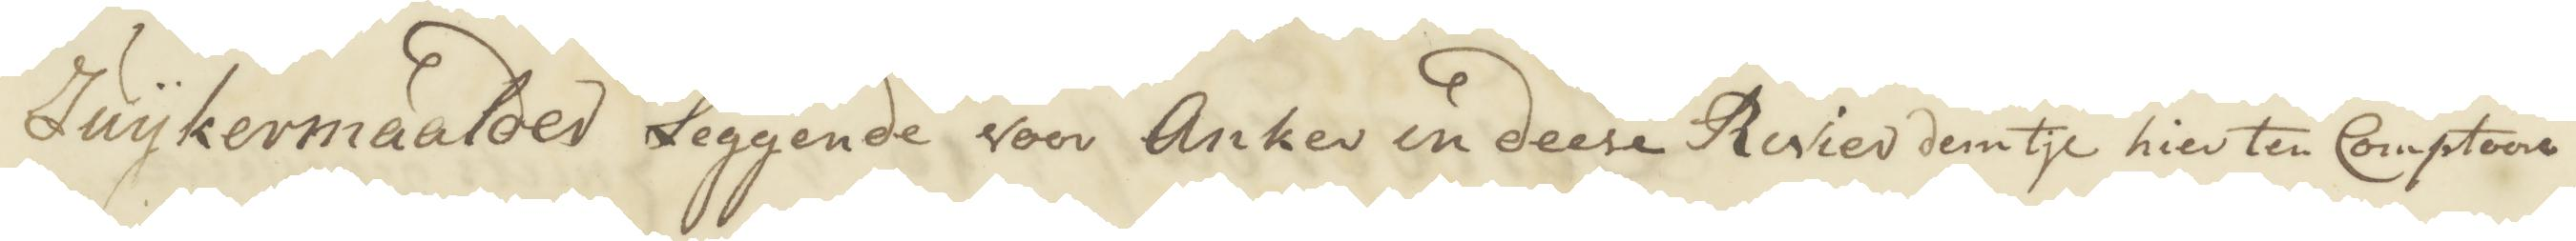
zuijkermaalder leggende voor anker in deese Rivier demtje hier ten comptoire
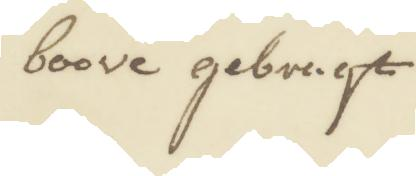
boove gebragt.
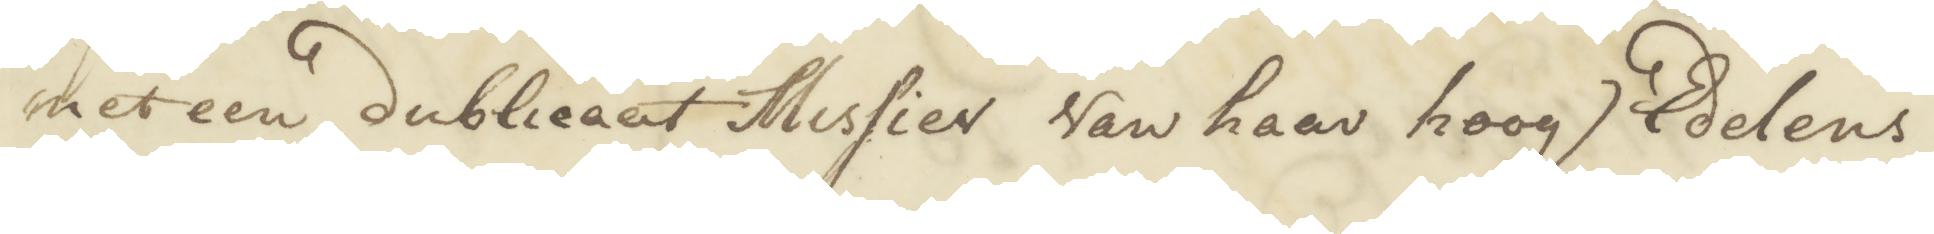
met een dublicaat Missiev van haar hoog Edelens
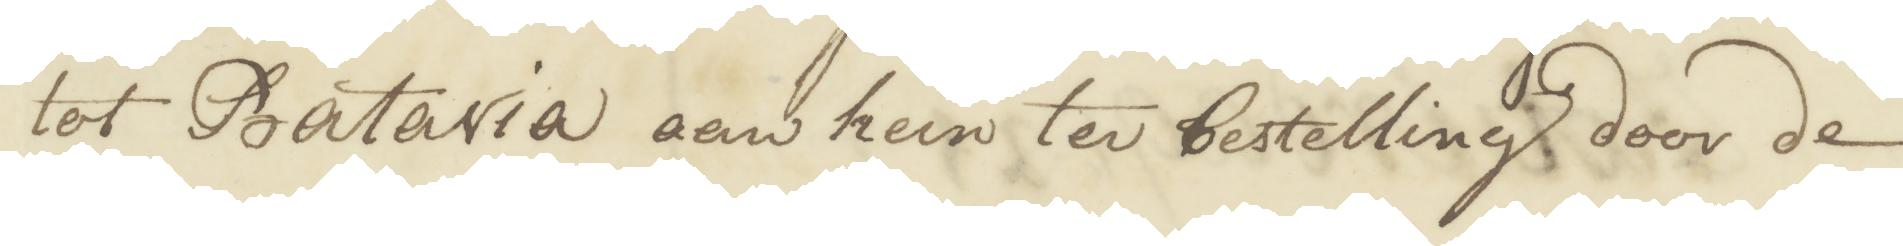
tot Batavia aan hem ter bestellingh door de
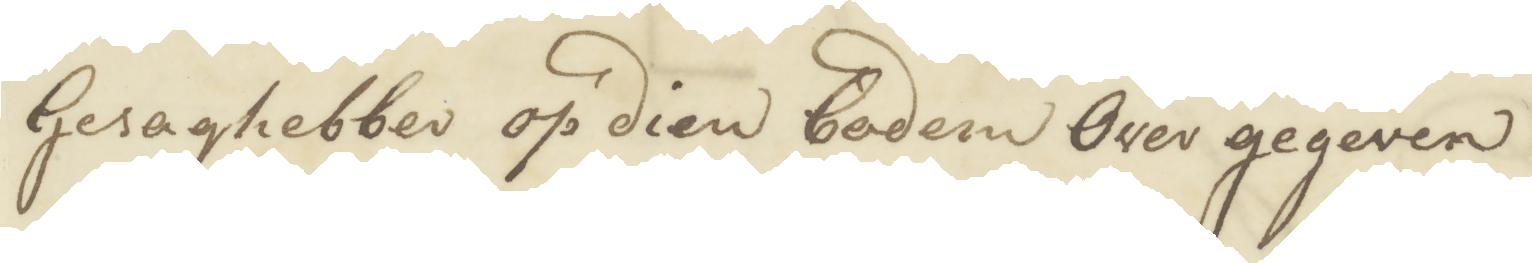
Gesaghebber op dien bodem over gegeven
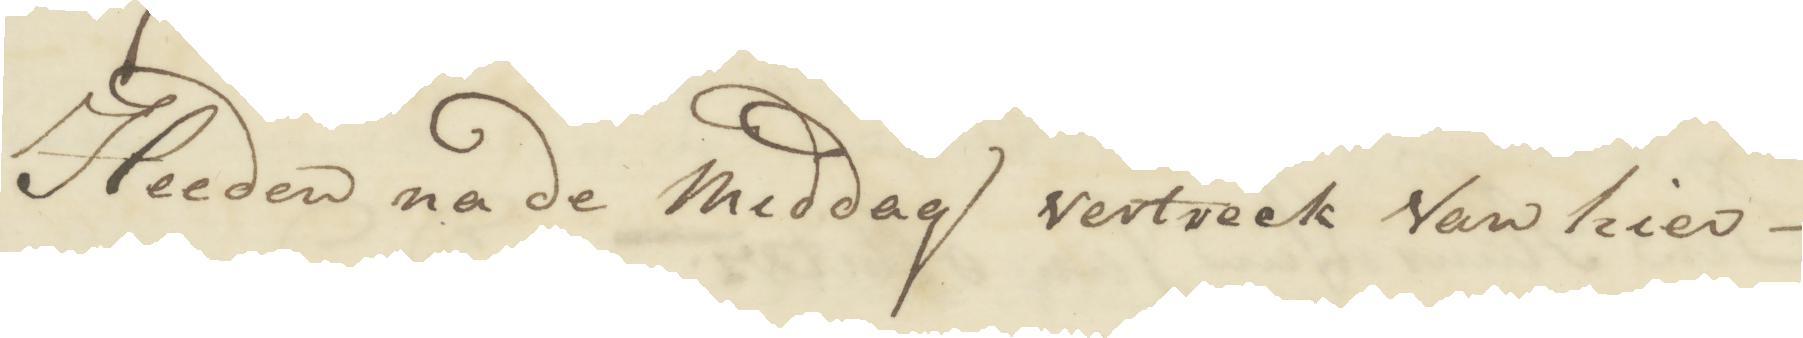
Heeden na de middag vertreck van hier
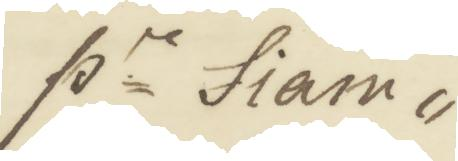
p=r siam„
